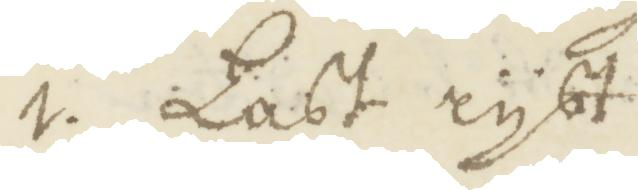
1. Last rijst
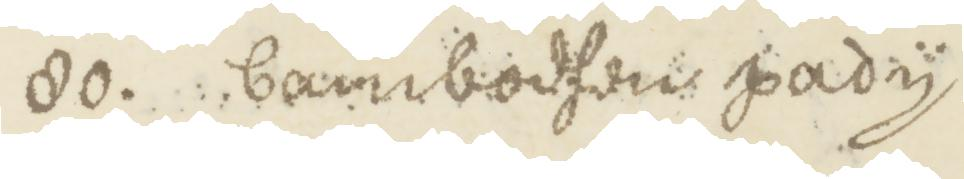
80. bamboesen padij
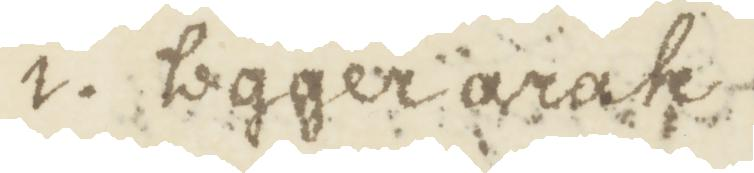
1. legger arak
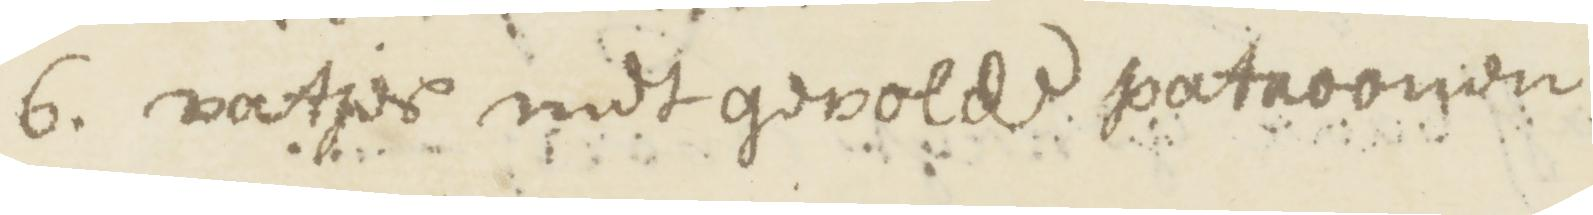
6. vatjes met gevolde patroonen
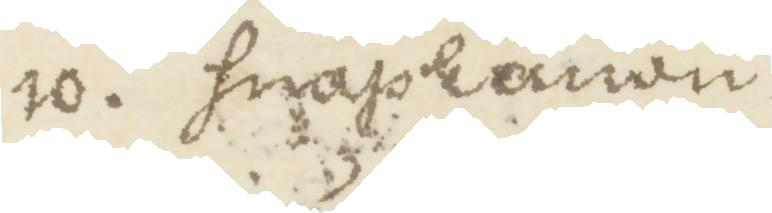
10. snaphanen
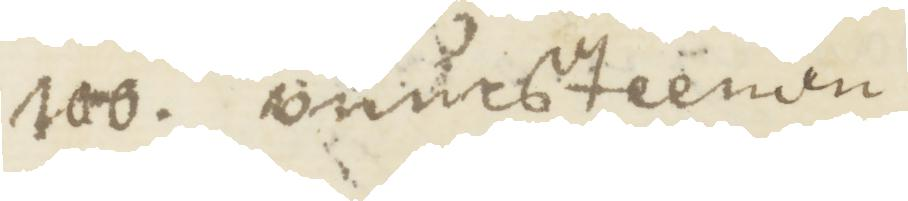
100. vuursteenen
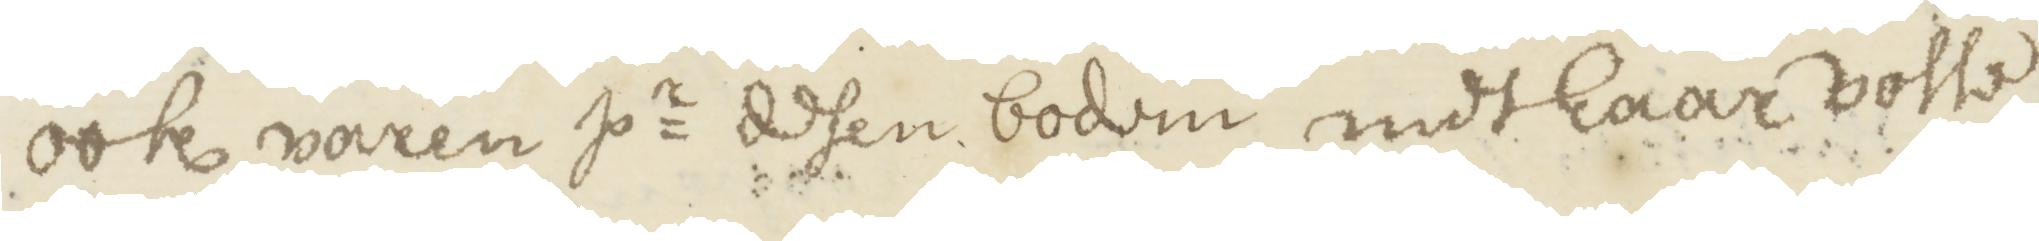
ook varen p=r desen bodem met haar volle
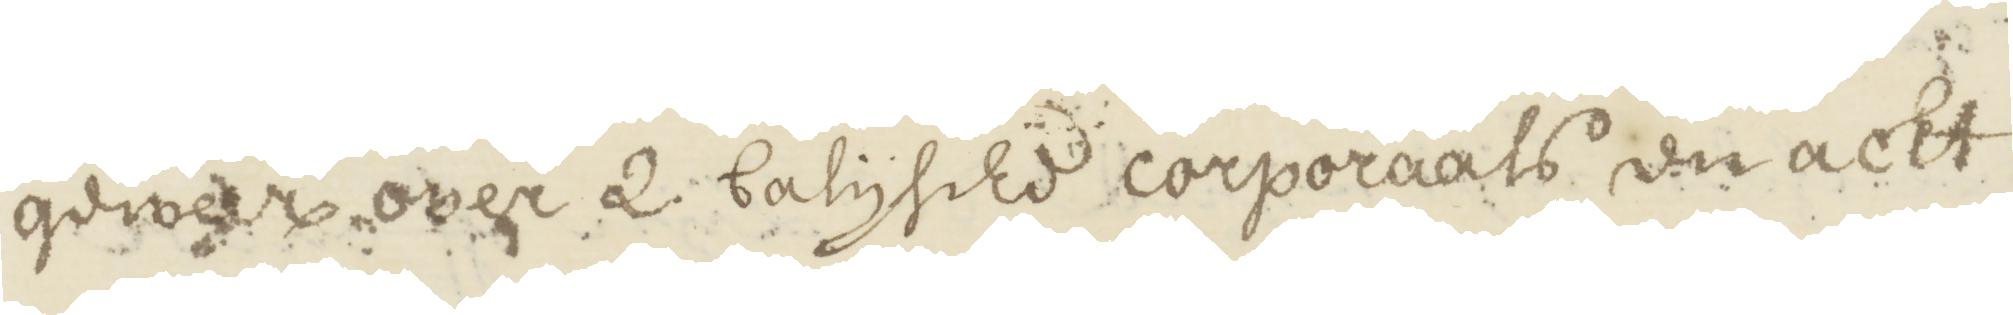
gewer over 2. balijsche corporaals en acht
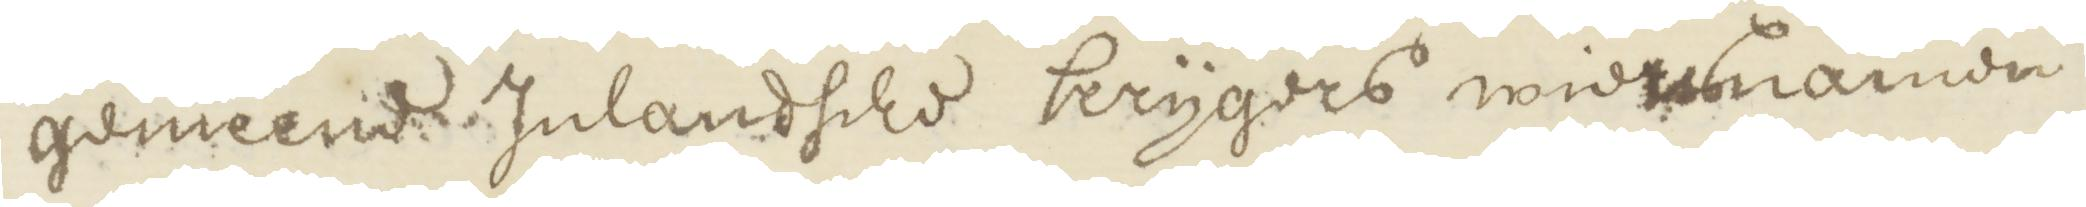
gemeene jnlandsche krijgers wiens namen
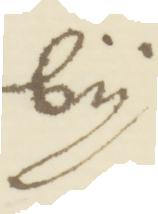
bij ./.
